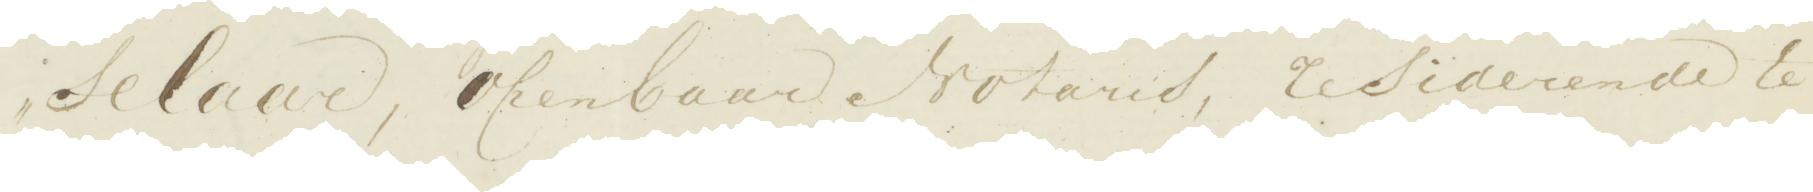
„selaar, openbaar Notaris, residerende te
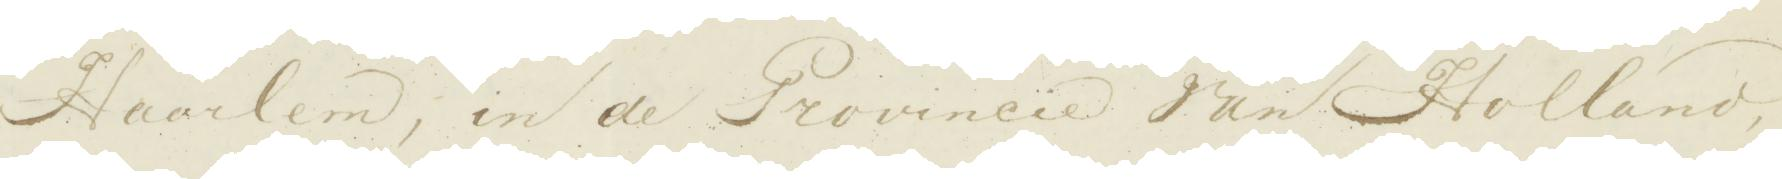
Haarlem, in de Provincie van Holland,
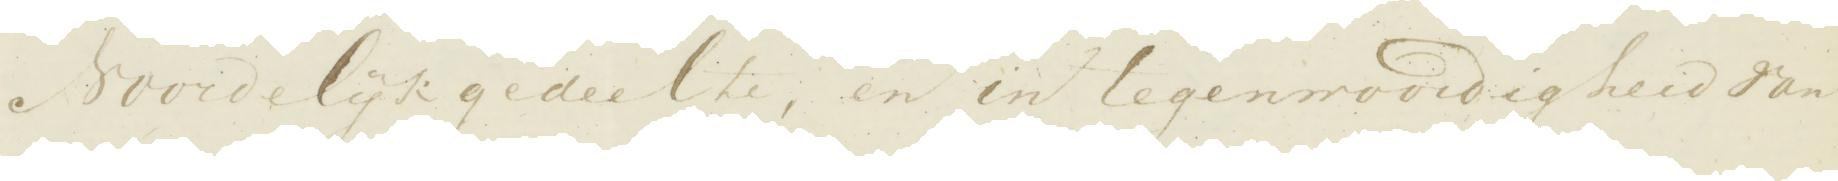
Noordelijk gedeelte, en in tegenwoordigheid van
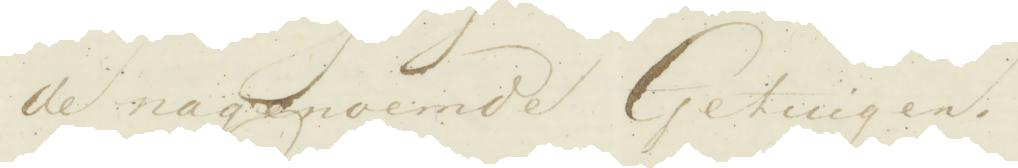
de nagenoemde Getuigen.
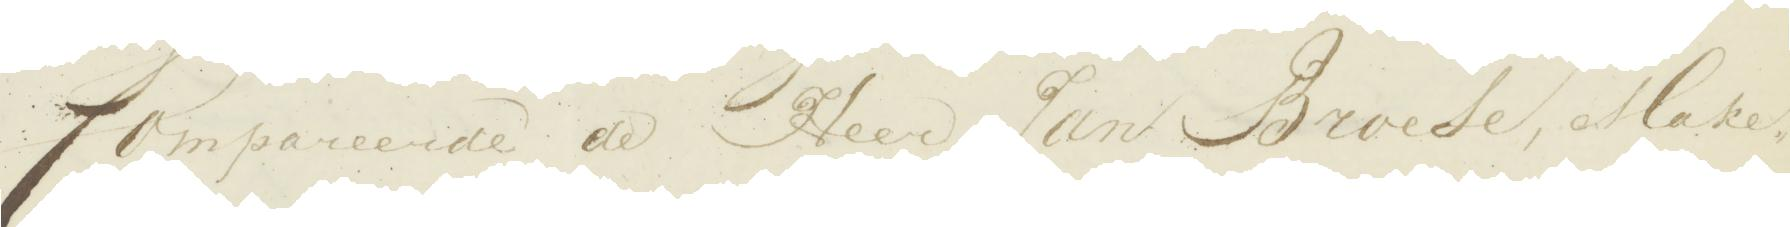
Compareerde de Heer Jan Broese, Make
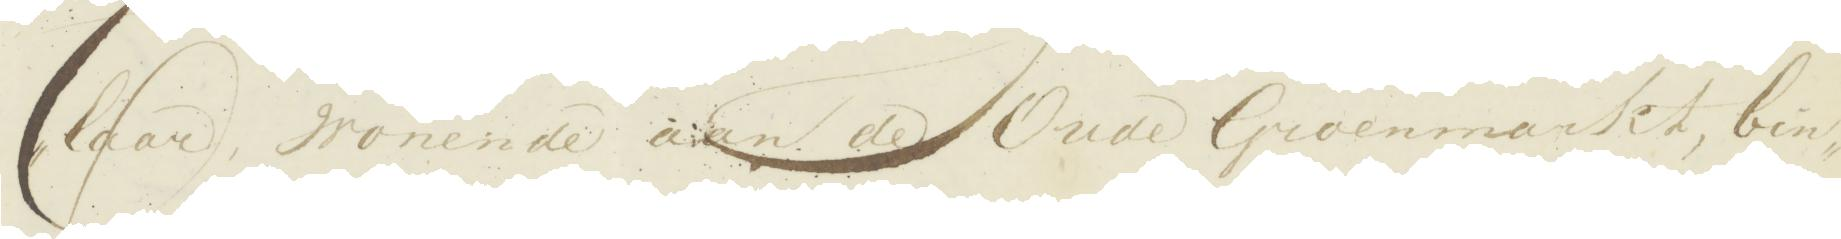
laar, wonende aan de Oude Groenmarkt, bin
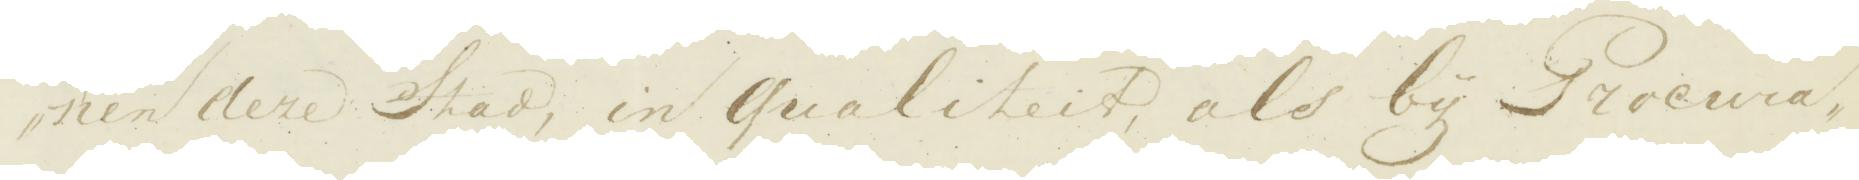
„nen deze Stad; in qualiteit, als bij Procura„
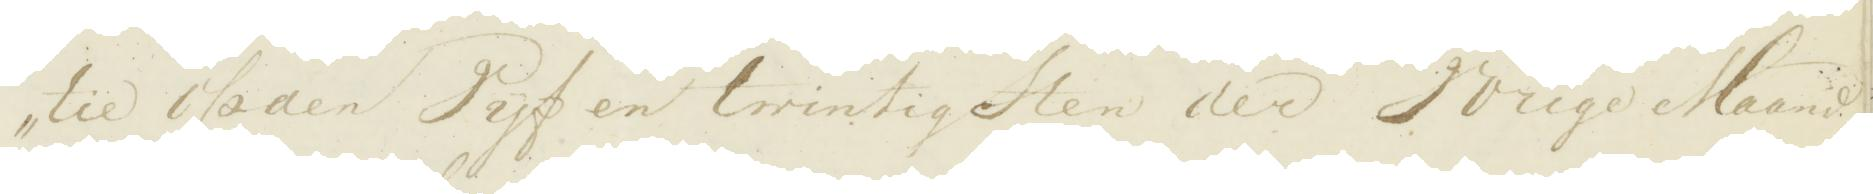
„tie op den Vijf en twintigsten der Vorige Maand
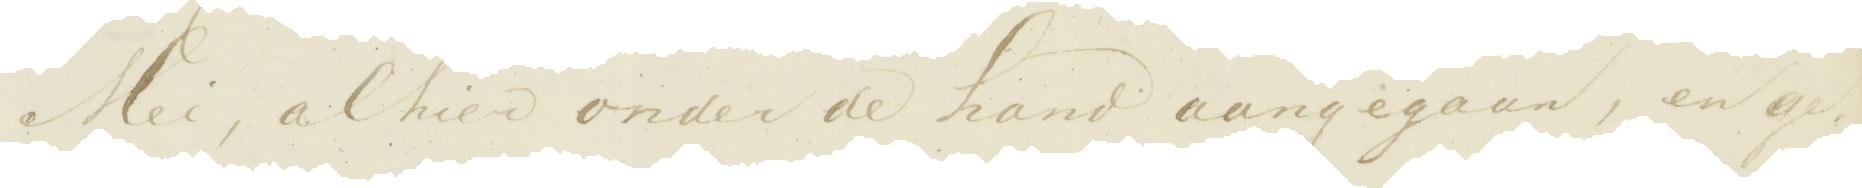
Mei, alhier onder de hand aangegaan, en ge„
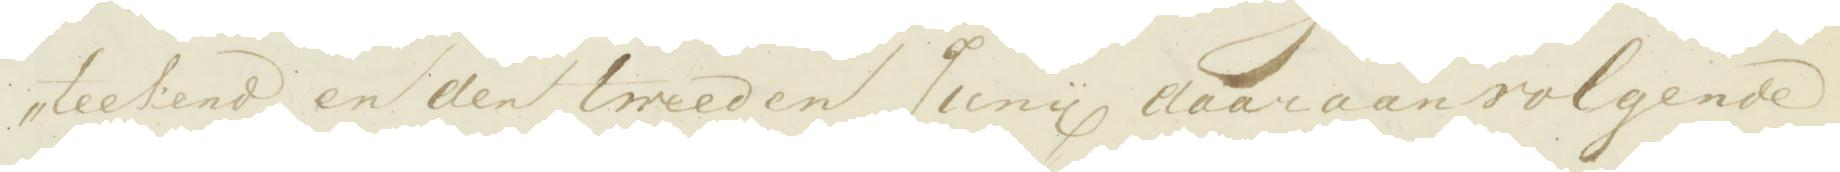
„teekend, en den tweeden Junij daar aan volgende
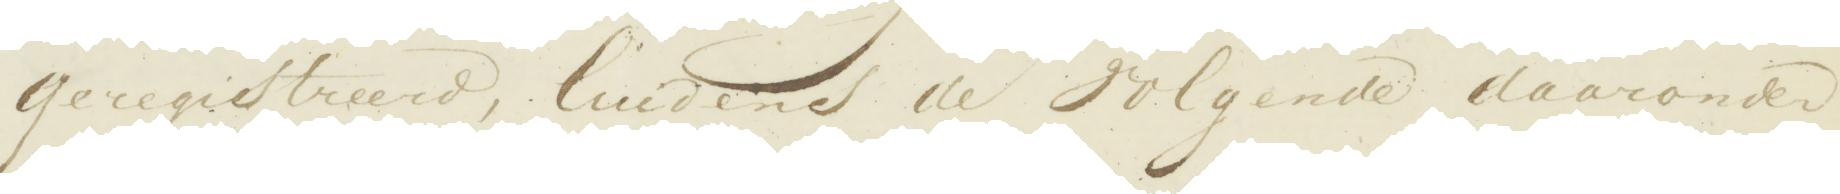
geregistreerd, luidens de volgende daaronder
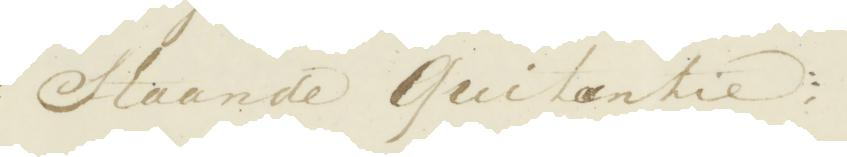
Staande Quitantie;
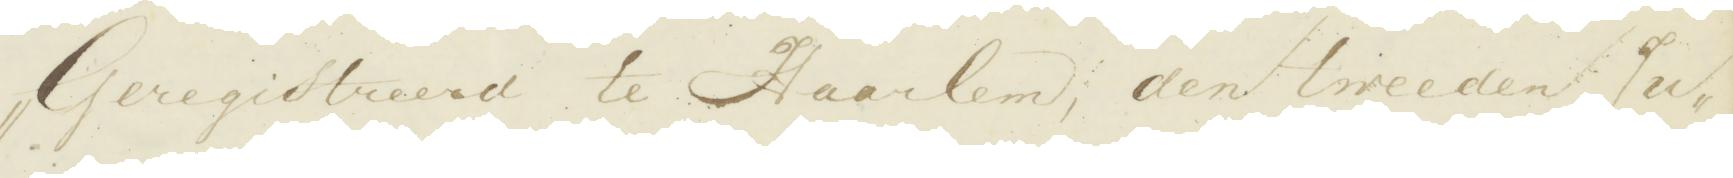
„ Geregistreerd, te Haarlem; den tweeden Ju„
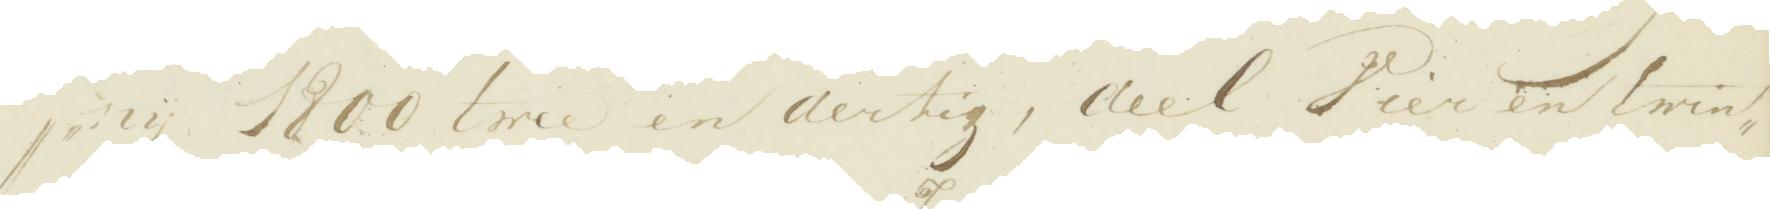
„ „nij 1800 twee en dertig, deel Vier en twin„
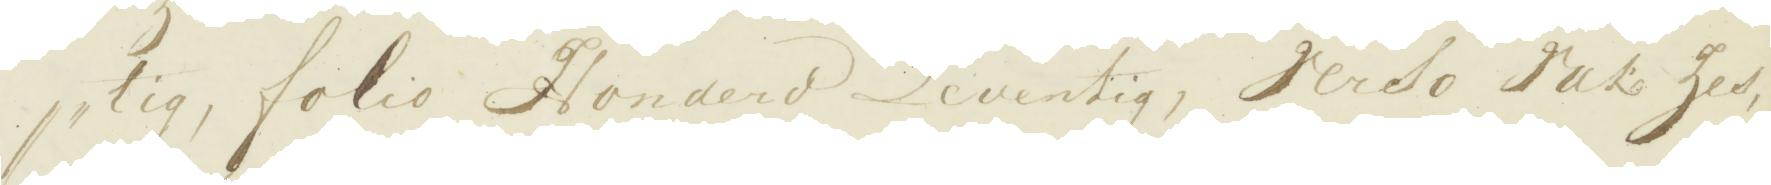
„ „tig, folio Honderd Zeventig, Verso Vak Zes,
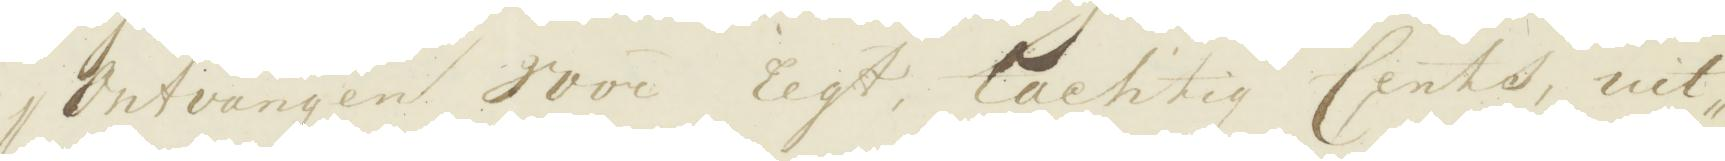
„ ontvangen voor regt, tachtig Cents, uit„
